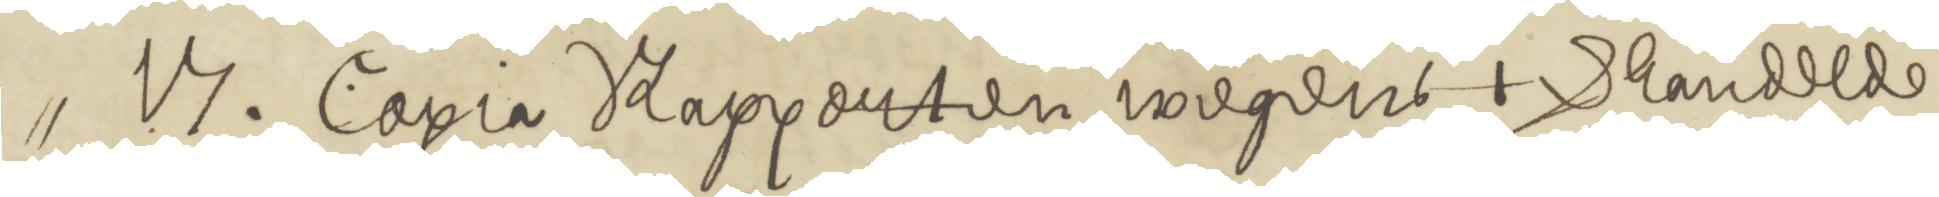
„ 17. Copia Rapporten wegens 't verhandelde
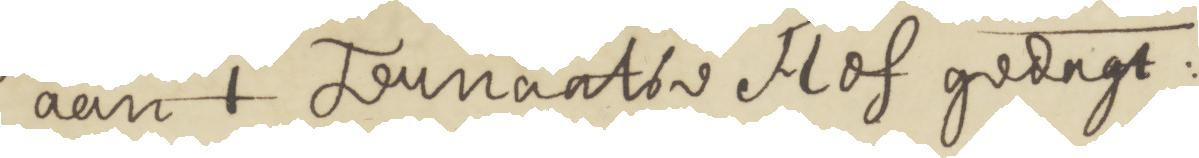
aan 't Ternaatse Hof gedagt:
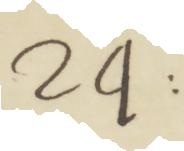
24:'
